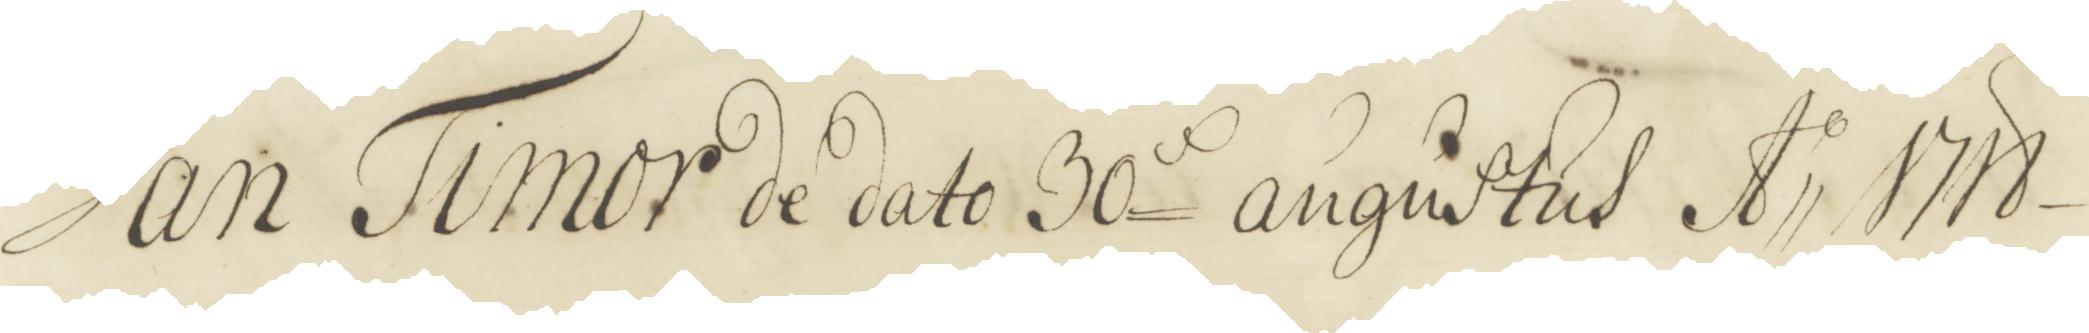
Van Timor de dato 30=e augustus A„o 1718
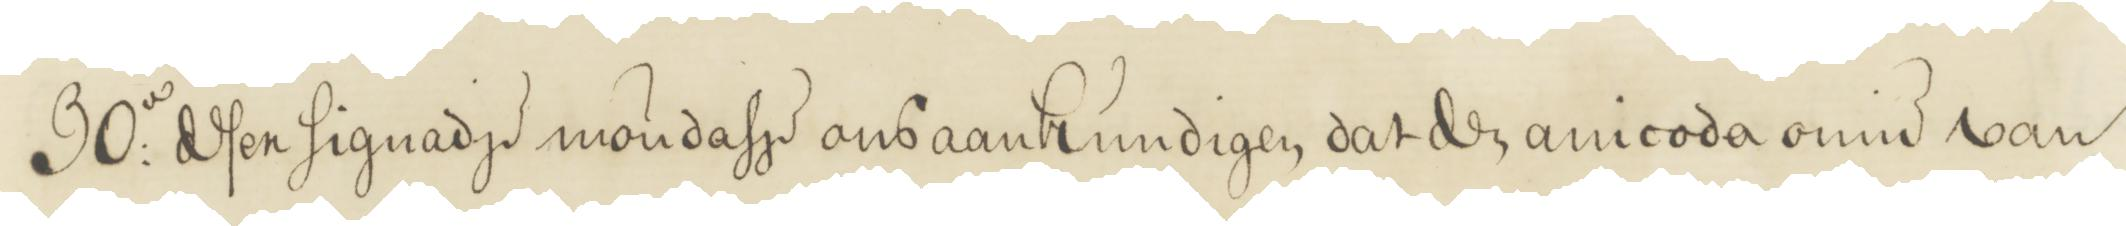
30: deser signadje moudasje ons aankundigen dat den anicoda omie van
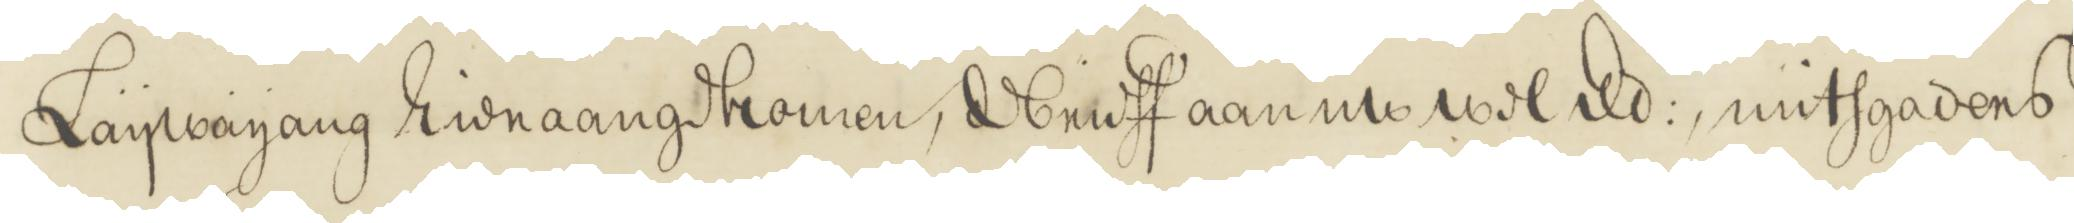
Laijwaijang hier aangekomen, de brieff aan uw wel Ed:es, mitsgaders
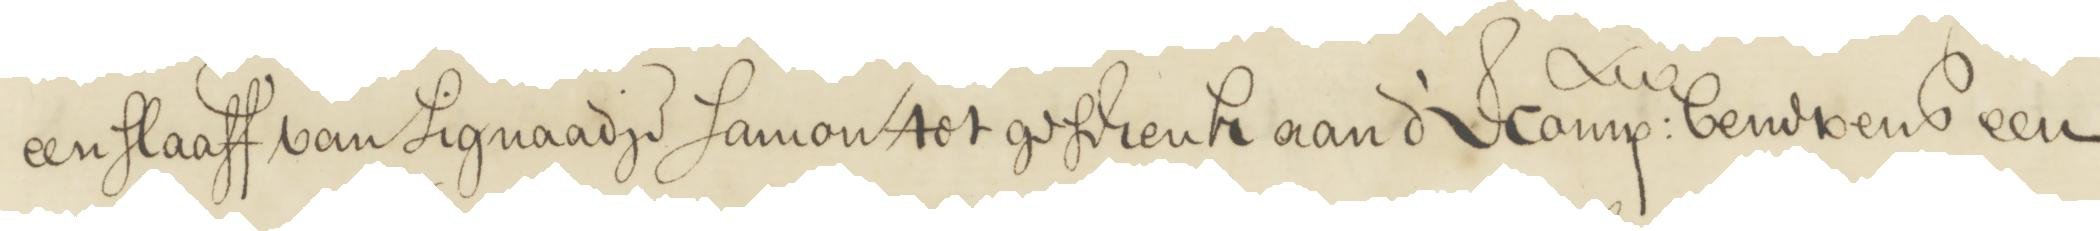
een slaaff van signaadje samon tot geschenk aan d’ Ecomp: benevens een
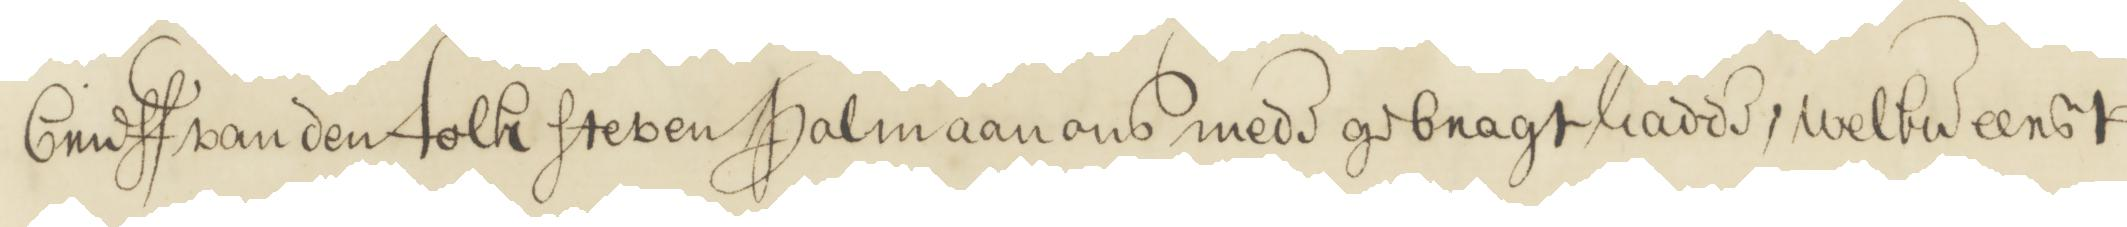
brieff van den tolk steven Palm aan ons mede gebragt hadde, welke eerst
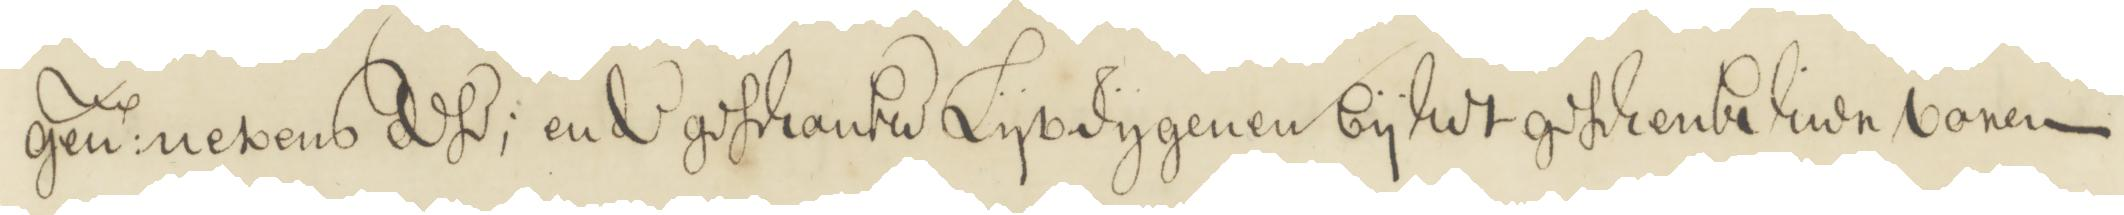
gen: nevens dese; ende geschonke Lijv Eijgenen bij het geschenk hier voren
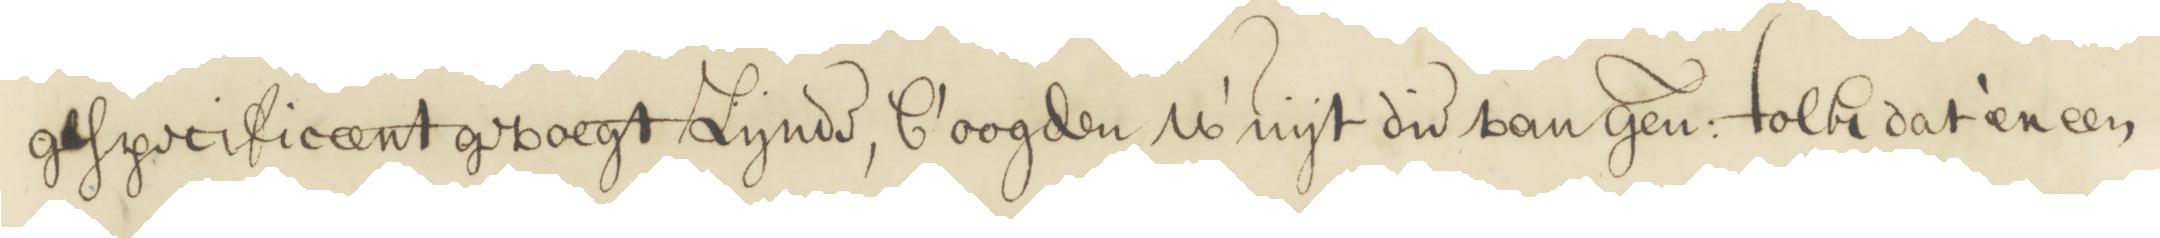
gespecificeert gevoegt zijnde, b'oogden w' uijt die van gen: tolk dat 'er een
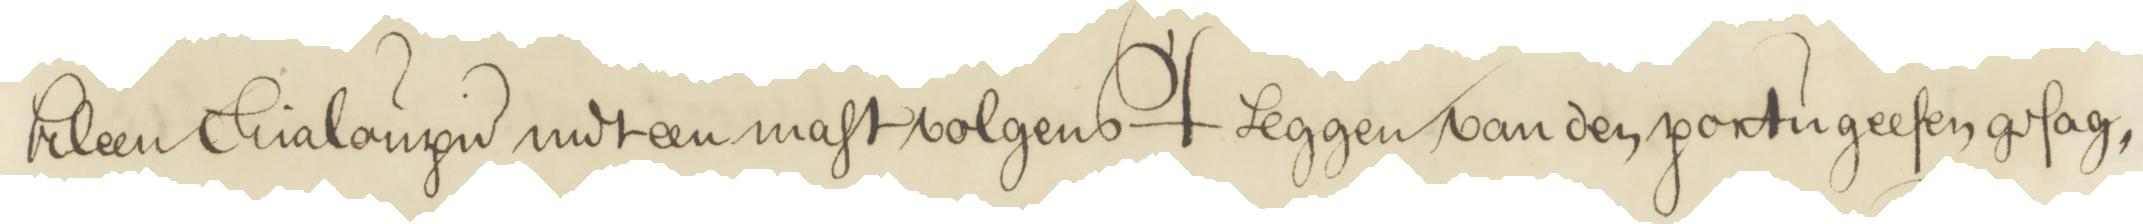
kleen Chialoupie met een mast volgens ’t seggen van den portugeesen gesag„
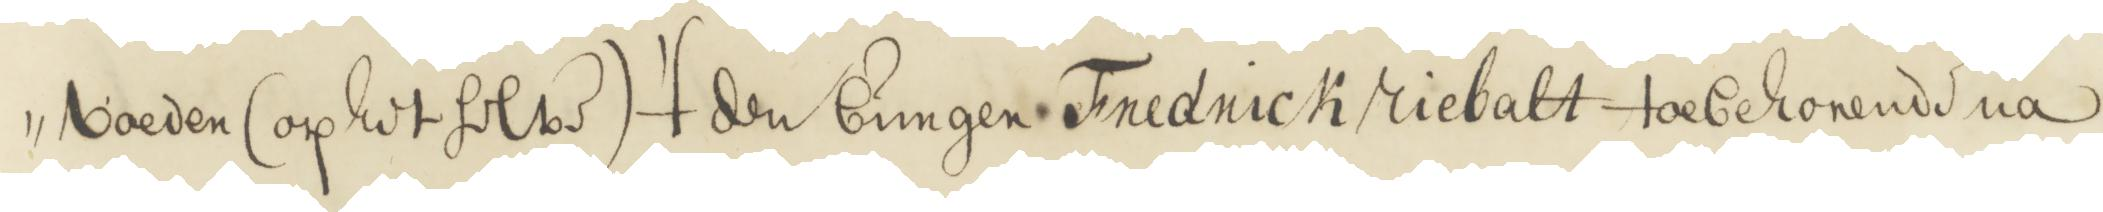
„voeder (op het selve) ’t den burger Fredrick riebalt toebehorende na
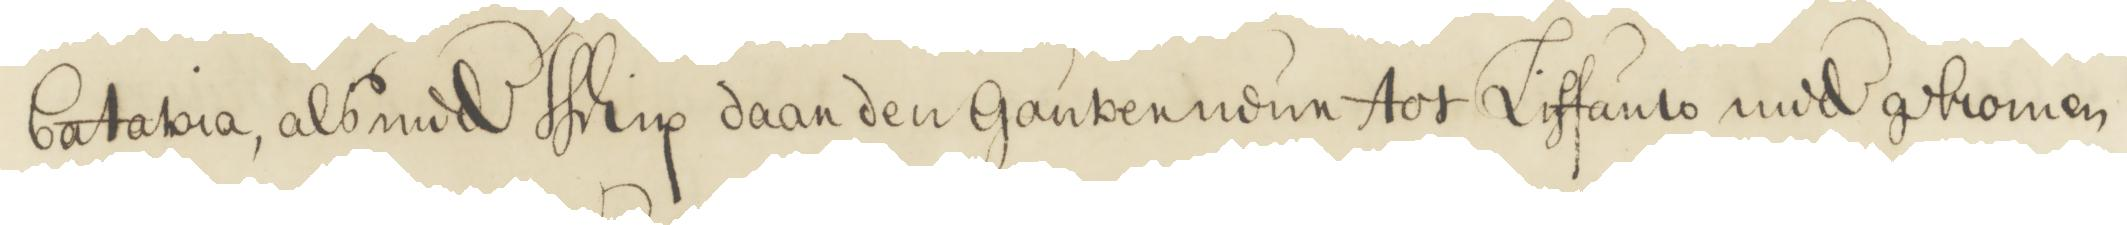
batavia, als mede t schip daar den Gouverneur tot Liffanto mede gekomen
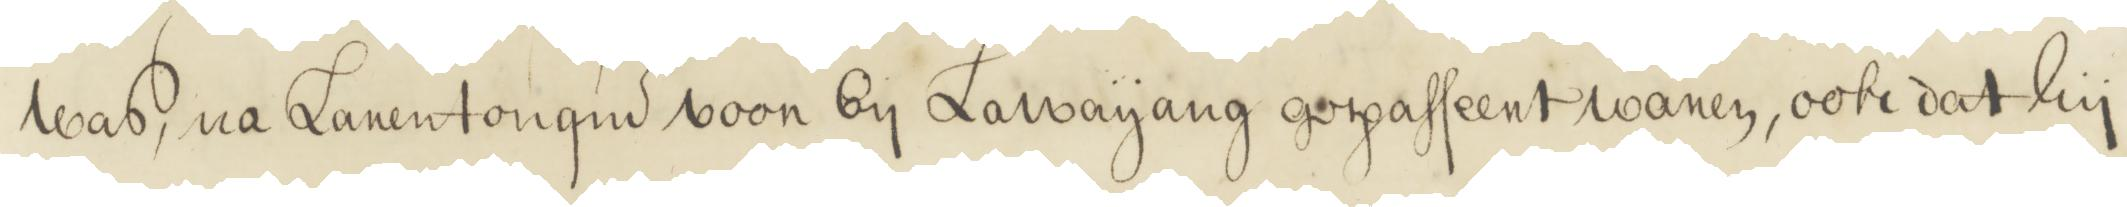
was, na Larentouque voor bij Lawaijang gepasseert waren, ook dat hij
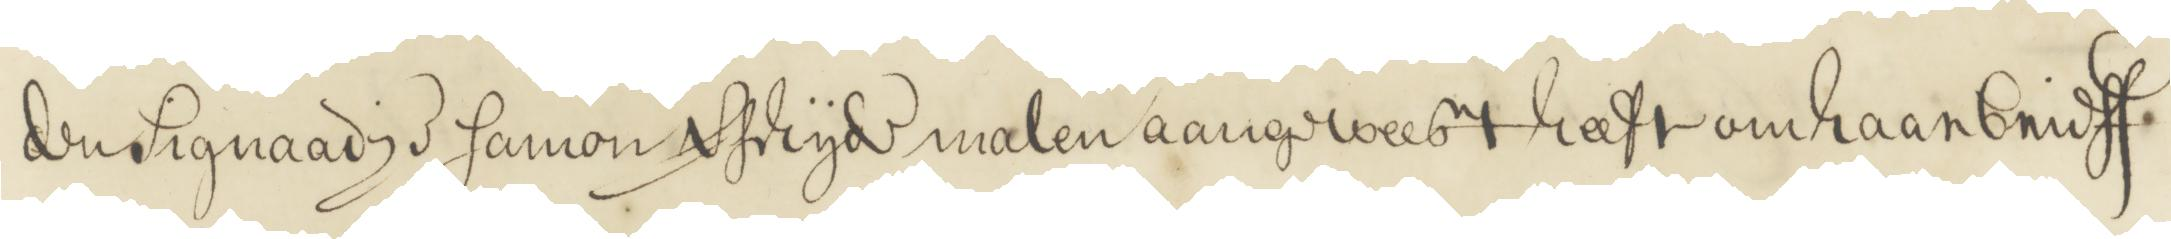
den signaadje samon verschijde malen aangeweest heeft om haar brieff
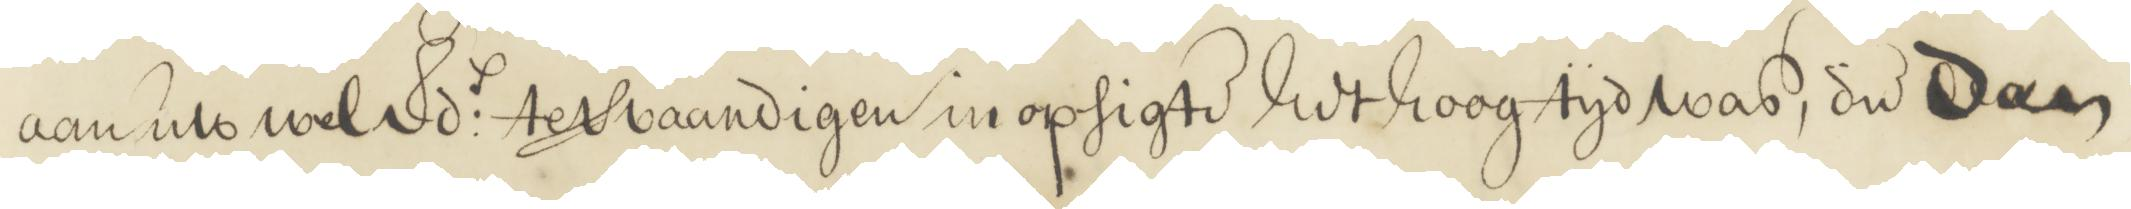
aan uw wel Ed:s te vervaardigen in opsigte het hoog tijd was, die dan
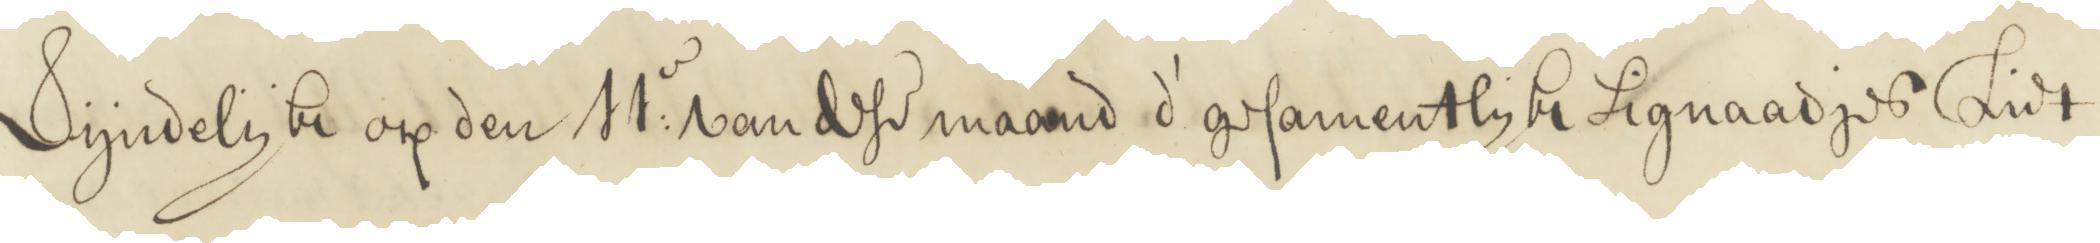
Eijndelijk op den 11:e van dese maand d’ gesamentlijk signaadjes liet
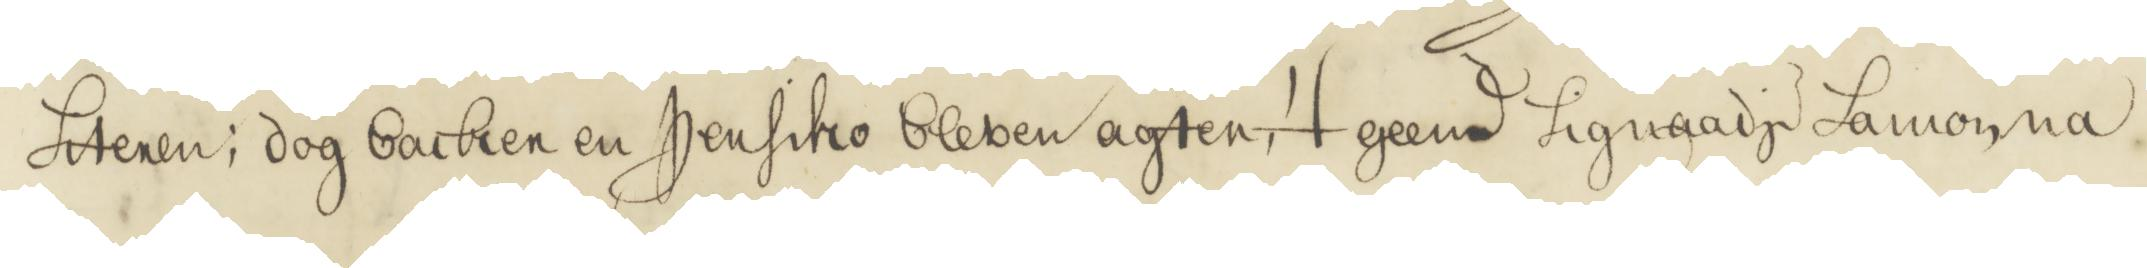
siteren; dog backer en persiko bleven agter, ’t geene signaadje samon na
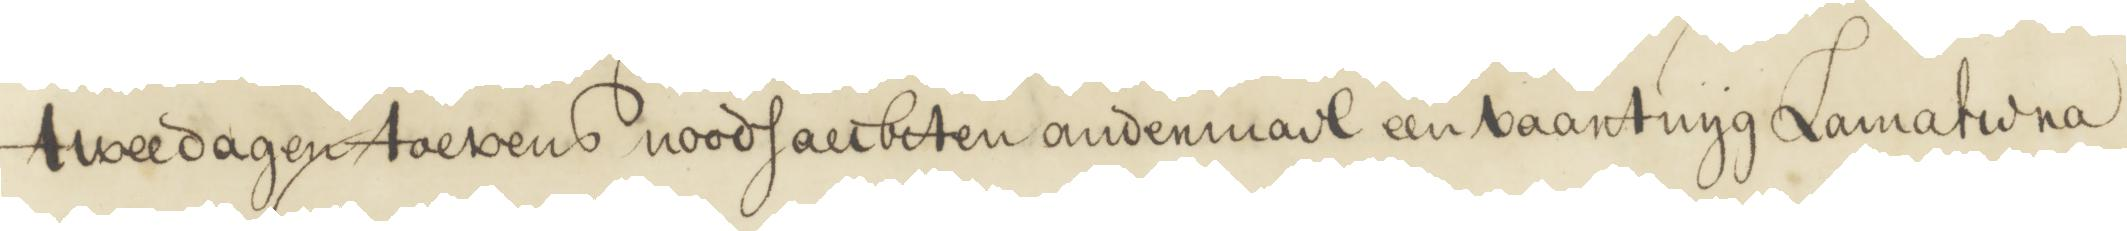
twee dagen toevens noodsaeckten andermael een vaartuijg Lamakera
